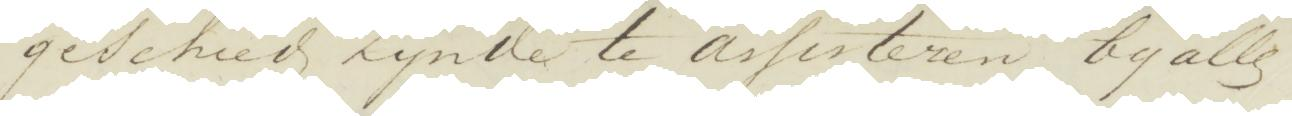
geschied zynde te assisteren by alle
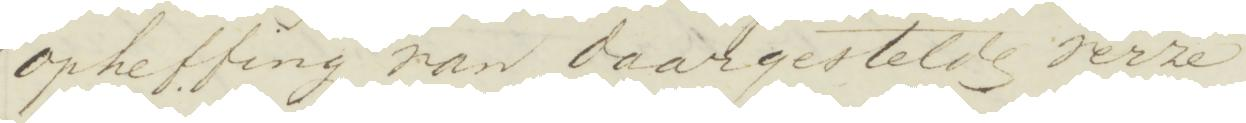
opheffing van daargestelde verze
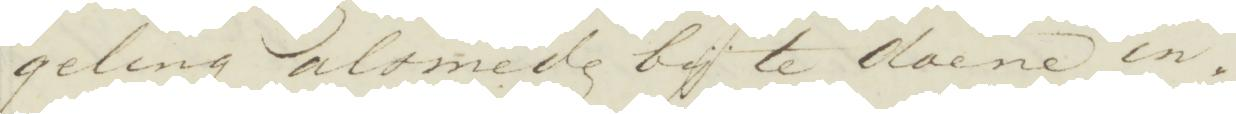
geling alsmede bij te doene in„
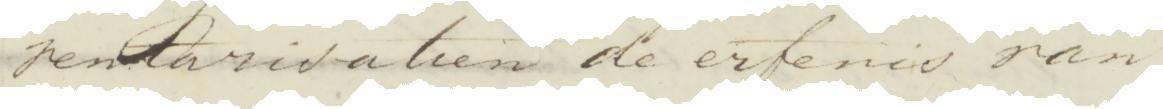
ventarisatien de erfenis van
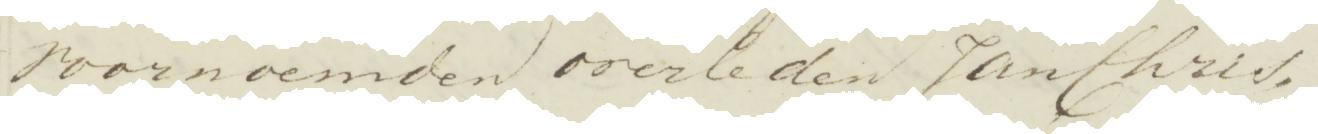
voornoemden overleden Jan Chris,
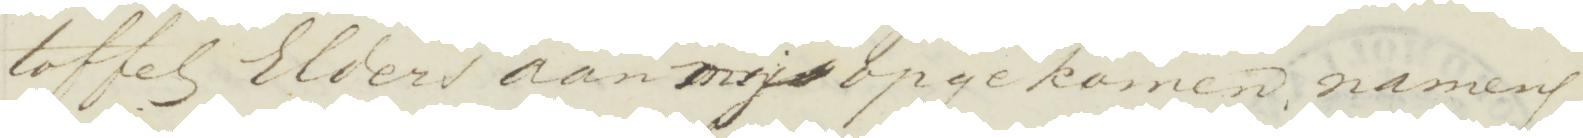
toffel Elders aan mij opgekomen namens
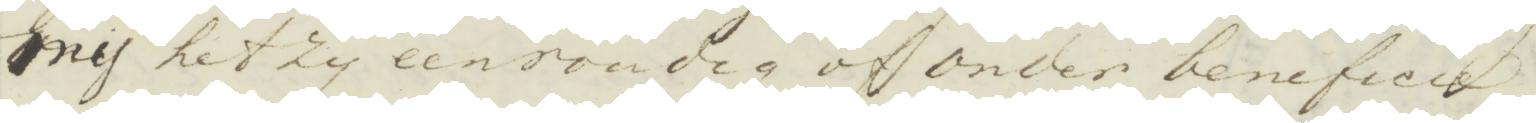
mij het zij eenvoudig of onder benificie
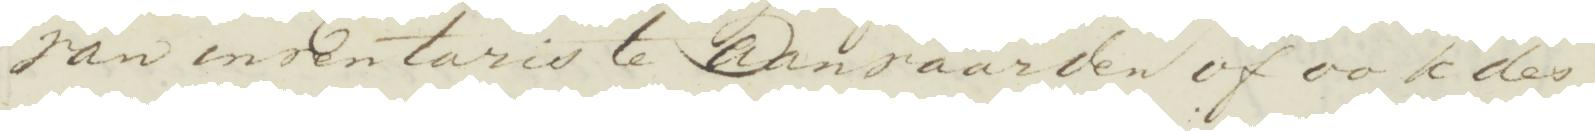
van inventaris te aanvaarden of ook des
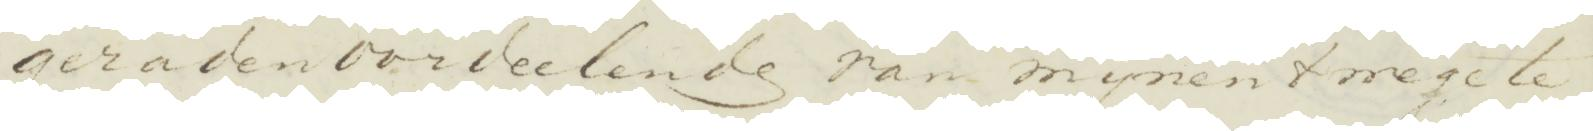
geraden oordeelende van mijnen twege te
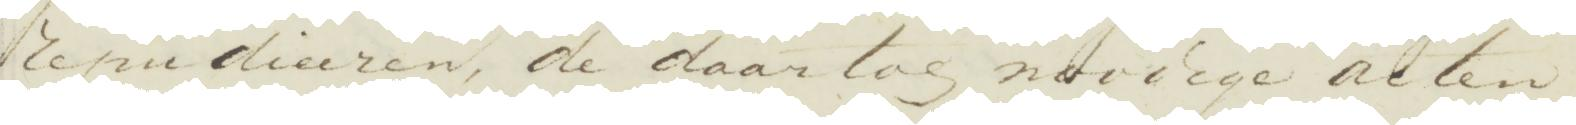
repudieeren, de daar toe noodige acten
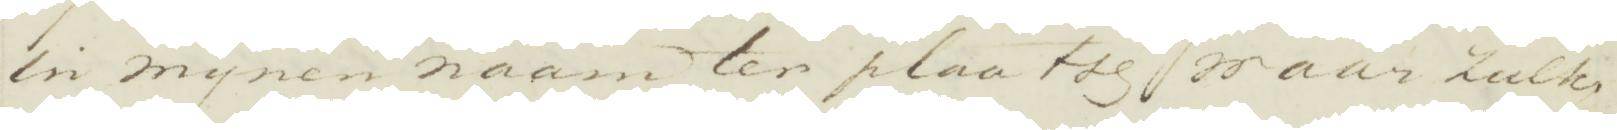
in mijnen naam ter plaatse waar zulks
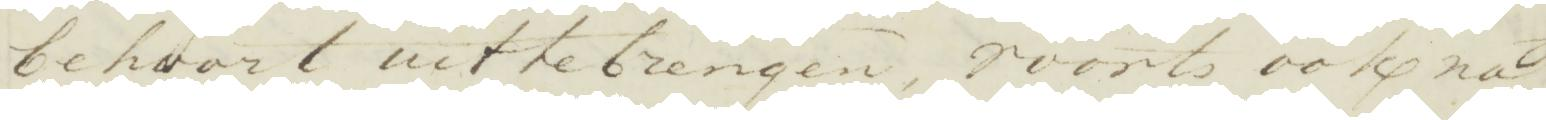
behoort uittebrengen, voorts ook na
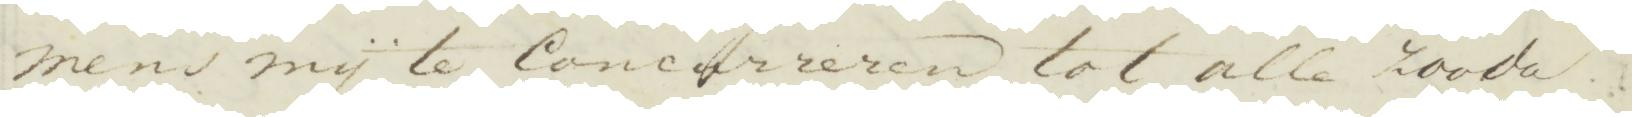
mens mij te Concurreren tot alle zooda.
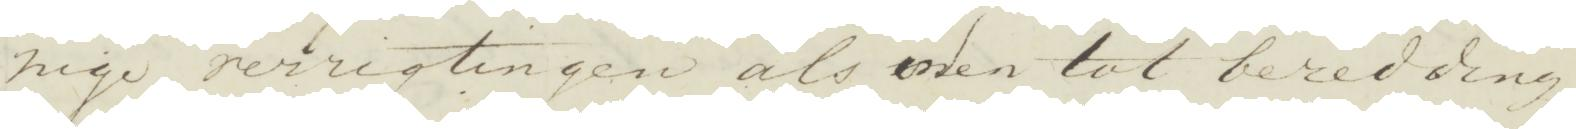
nige verrigtingen als in en tot beredding
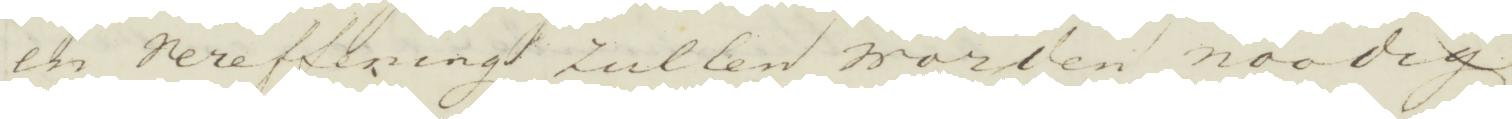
en vereffening zullen worden noodig
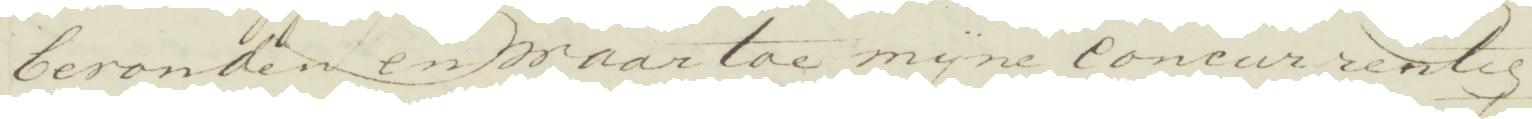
bevonden en waartoe mijne concurrentie
